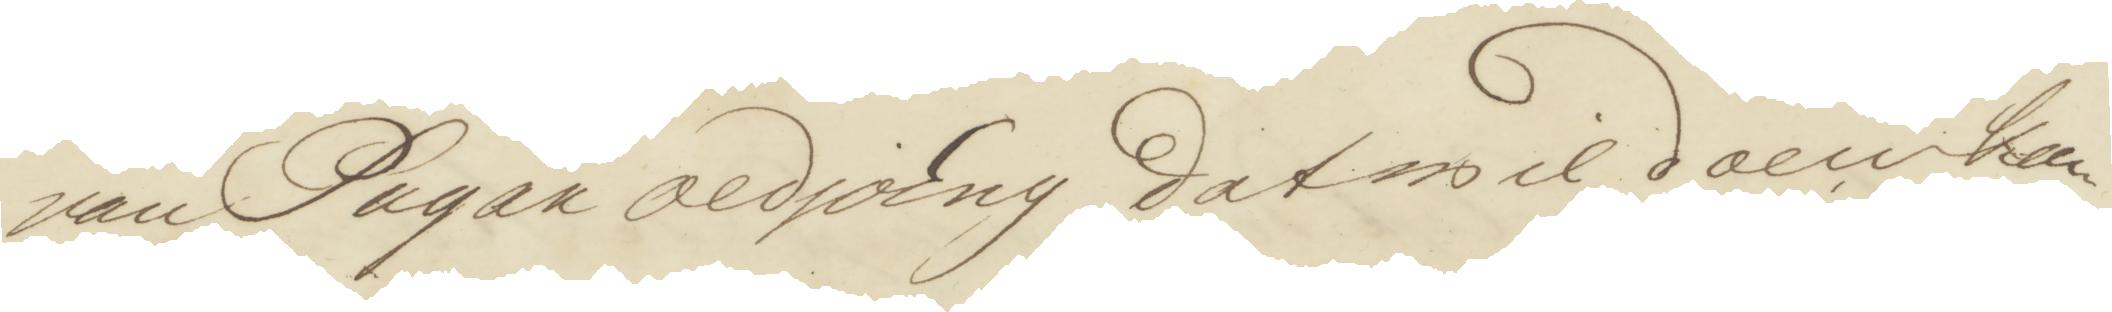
van Pagar oedjoeng dat wil doen, kan
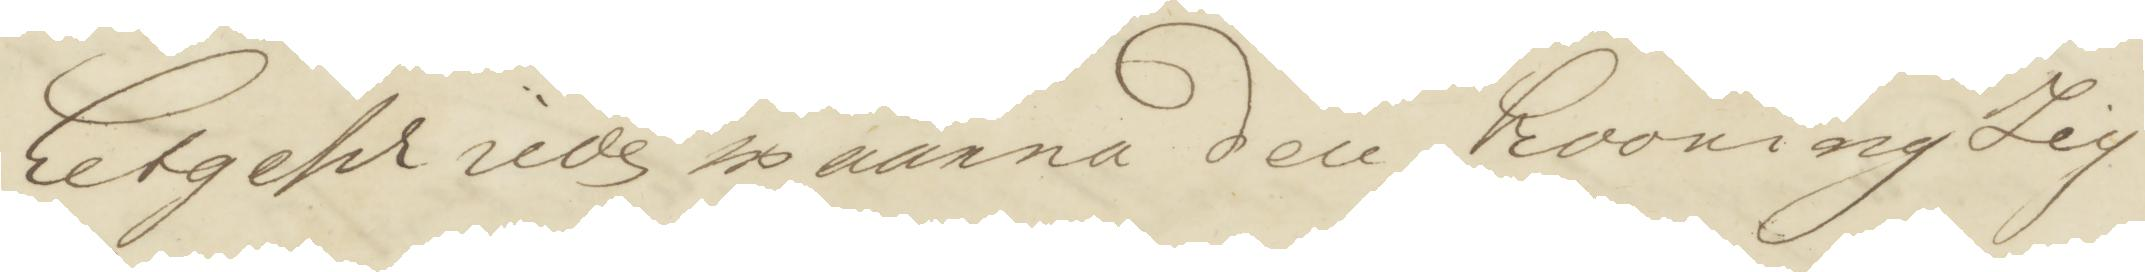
het geschieden waarna den kooning zig
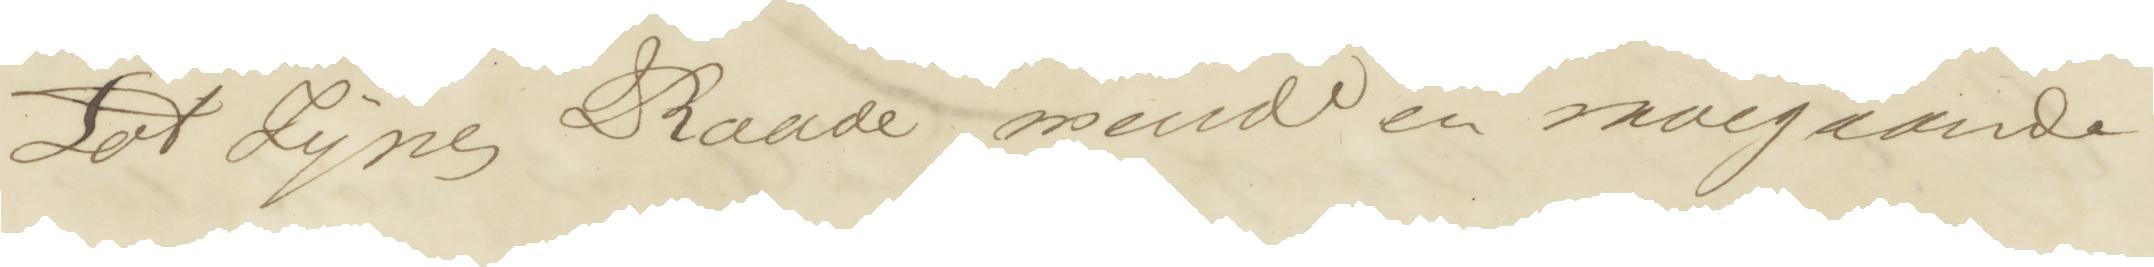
tot zijne Raade wende en vroeg aande
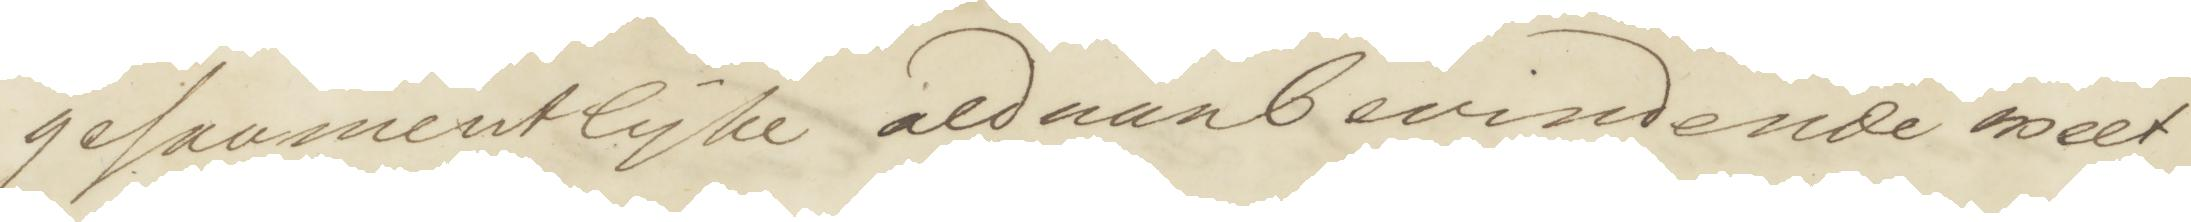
gesaamentlijke aldaar bevindende weet
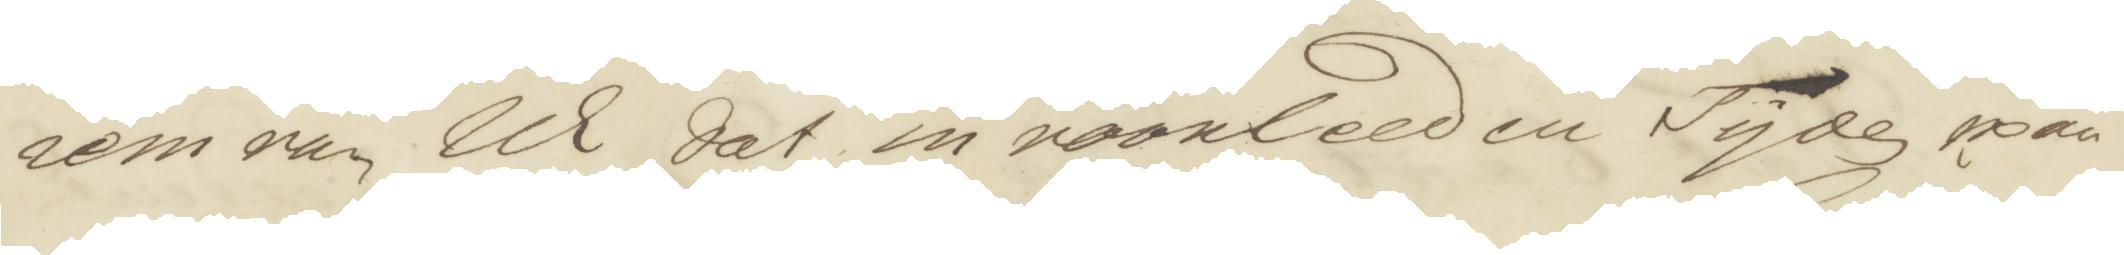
iem van UE dat in voorleeden tijden wan
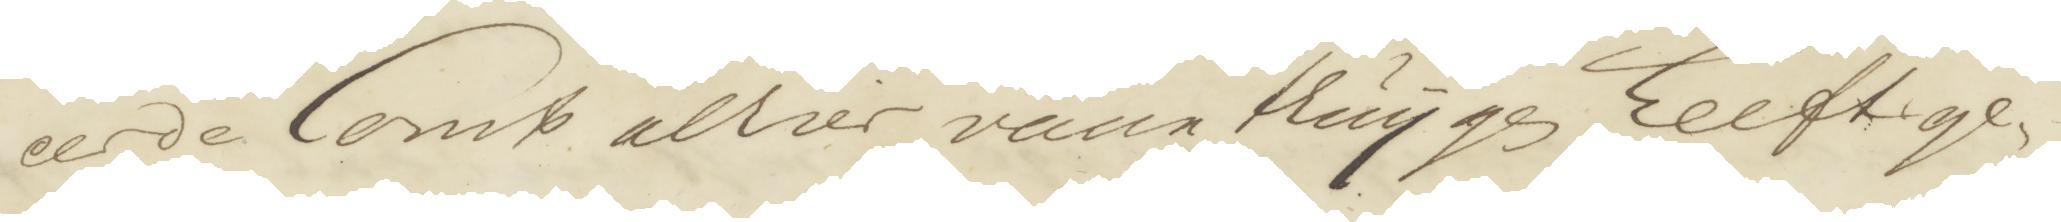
eer de Comp alhier vaarthuijgen heeft ge,
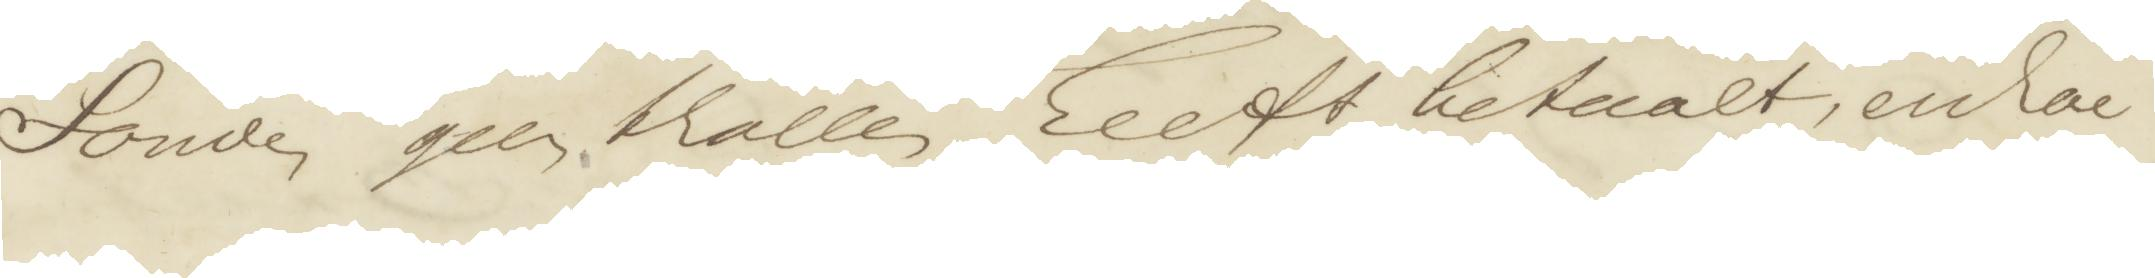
sonden geen thollen heeft betaalt, en hoe
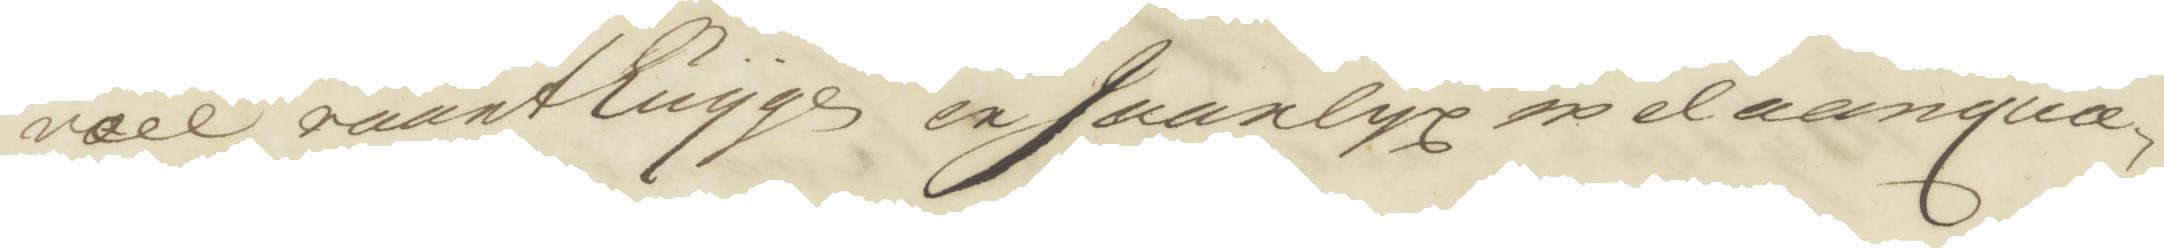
veel vaarthuijgen er Jaarlijx wel aanqua,
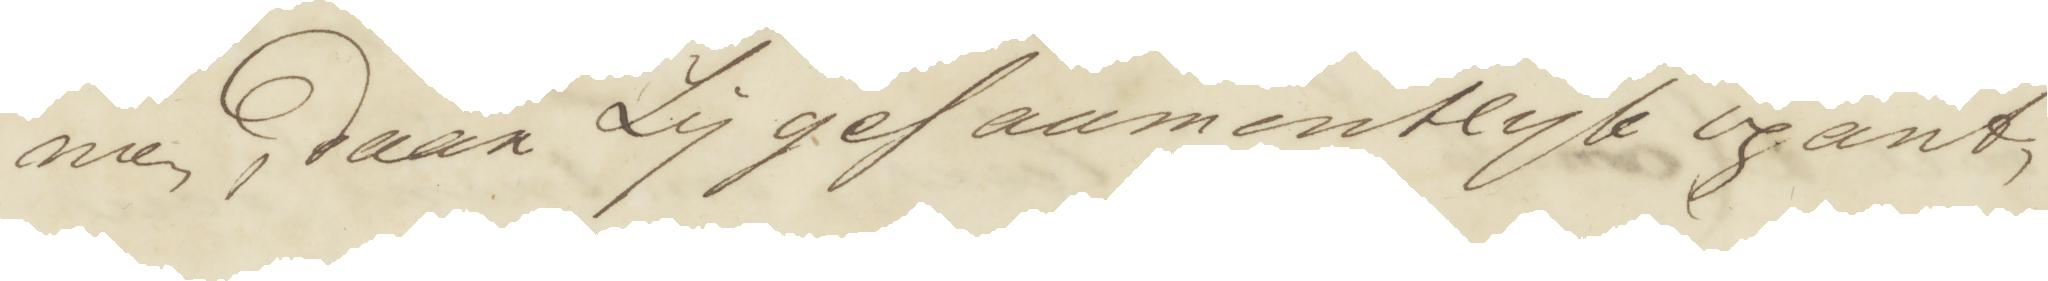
men, daar zij gesaamentlijk op ant,
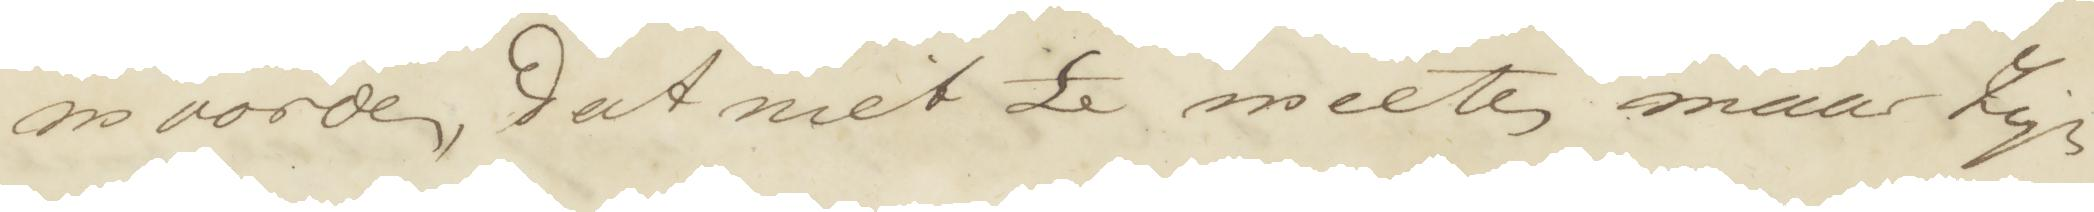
woorden dat niet te weeten maar zijn
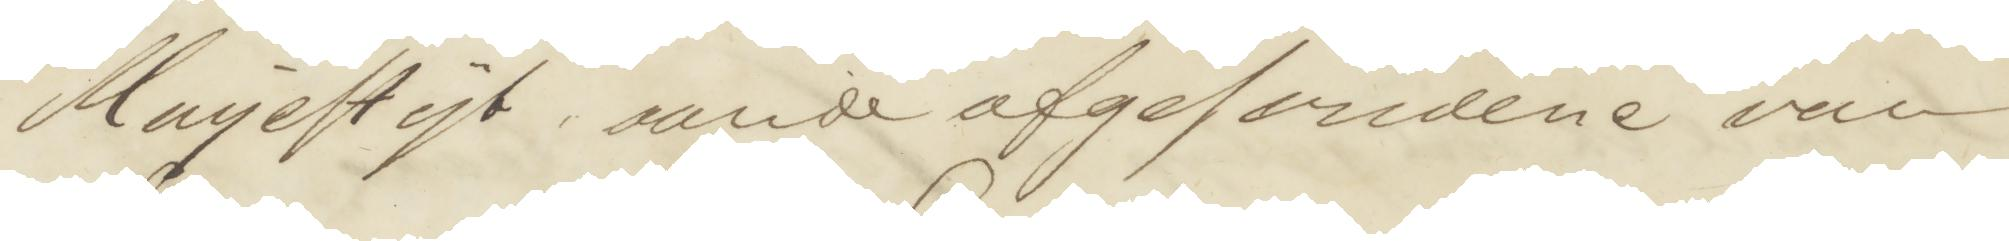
Maijestijt aan de afgesondene van
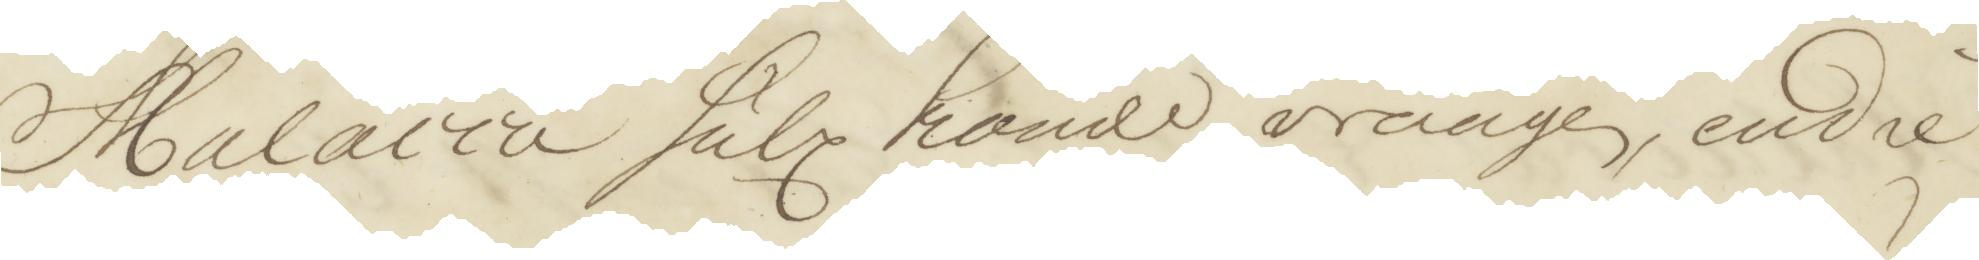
Malacca sulx konde vraagen, en die
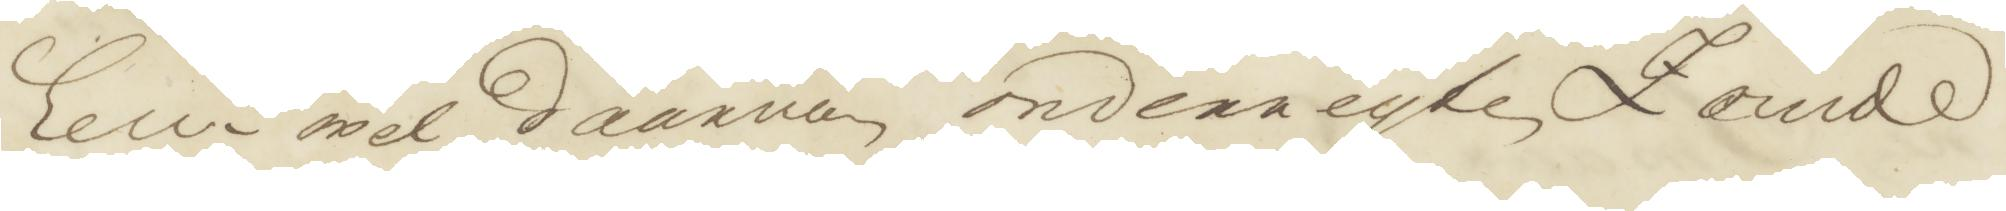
hem wel daarvan onderregten zoude
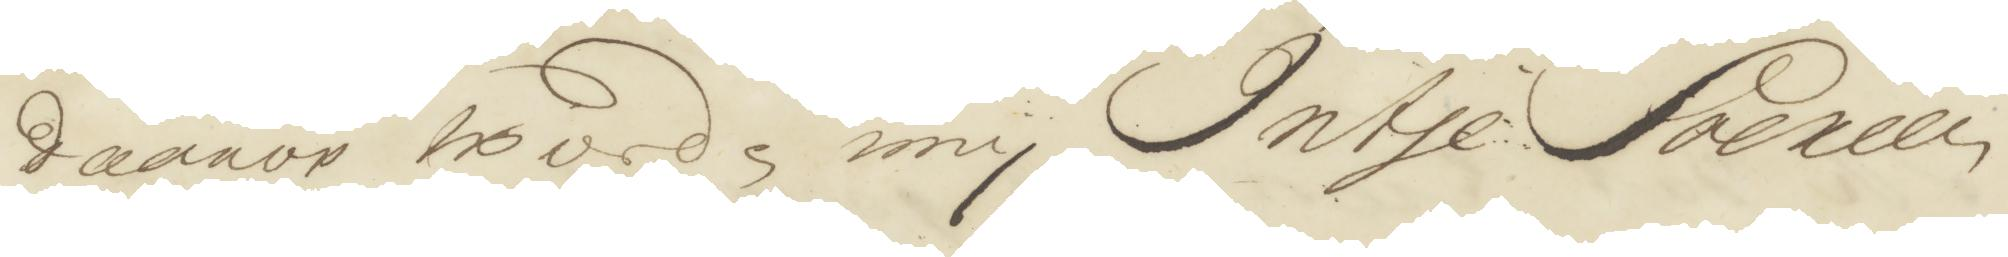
daarop werden mij Intje Soereen
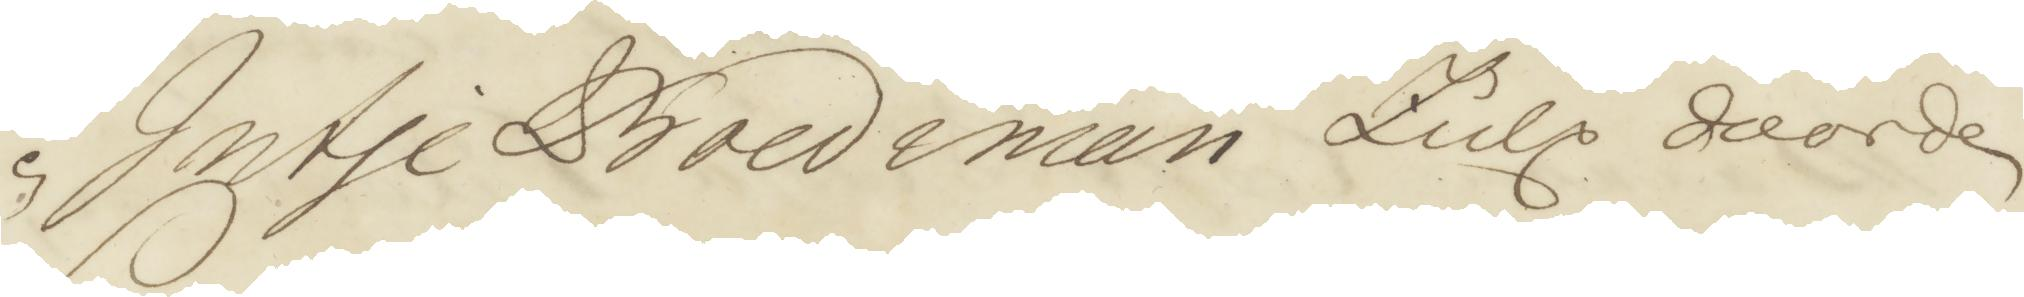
en Intje Boediman zulx door den
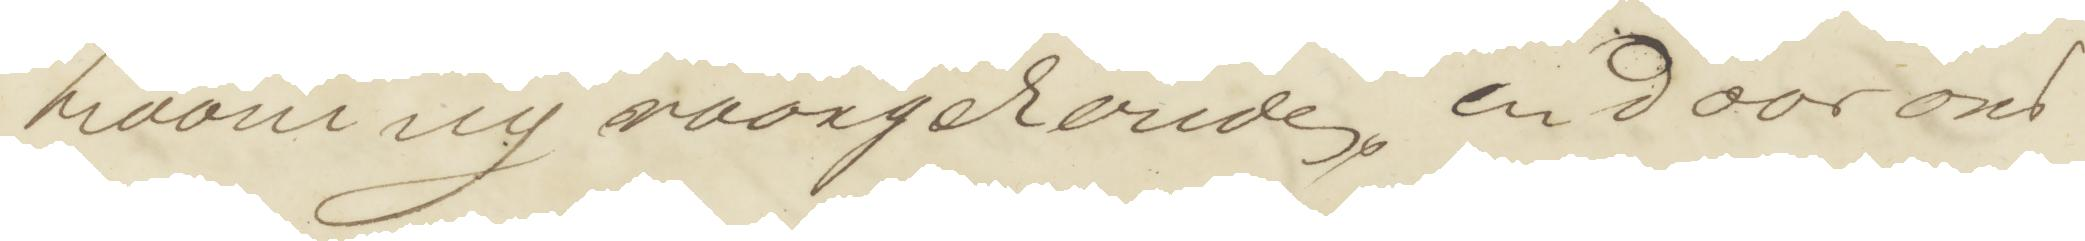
kooning voorgehouden, en door ons
